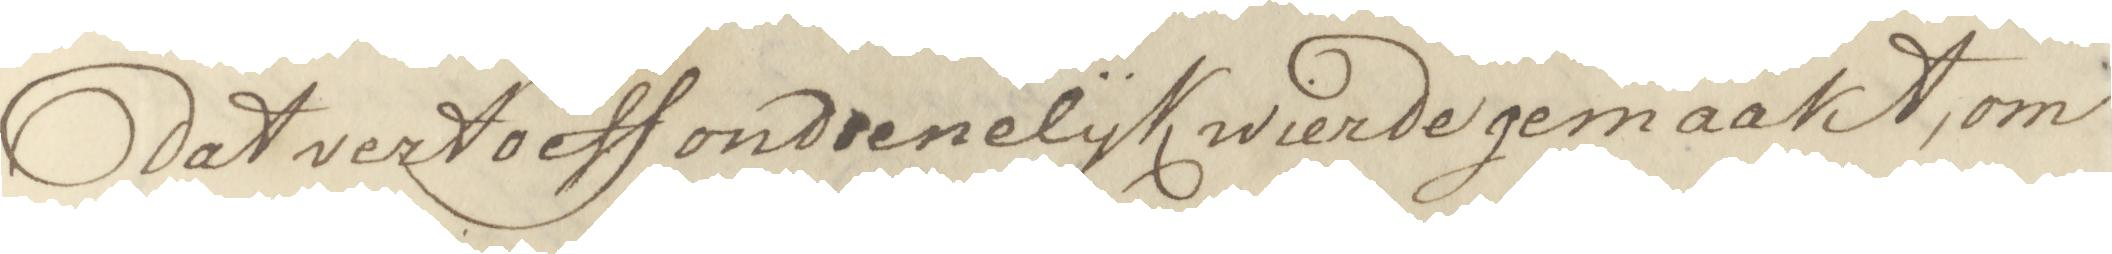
dat vertoeff ondoenelijk wierde gemaakt, om
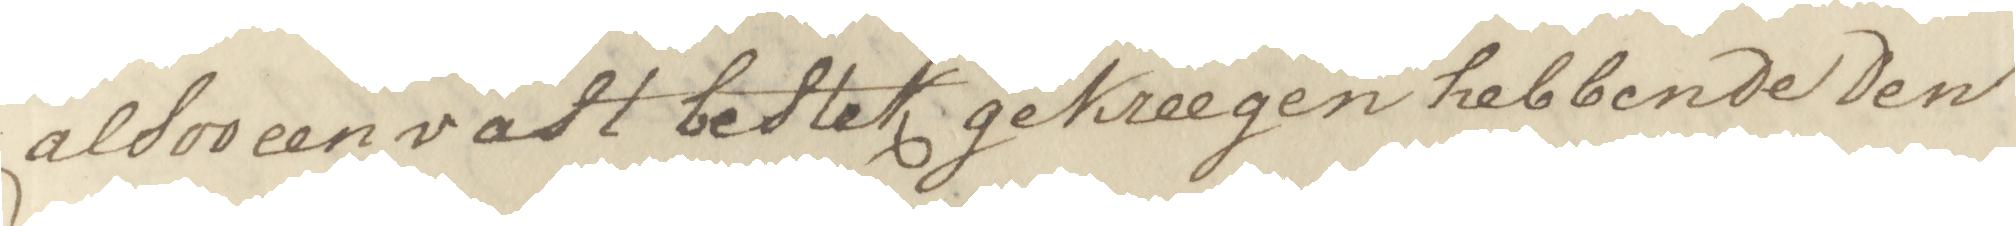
alsoo een vast bestek gekreegen hebbende den
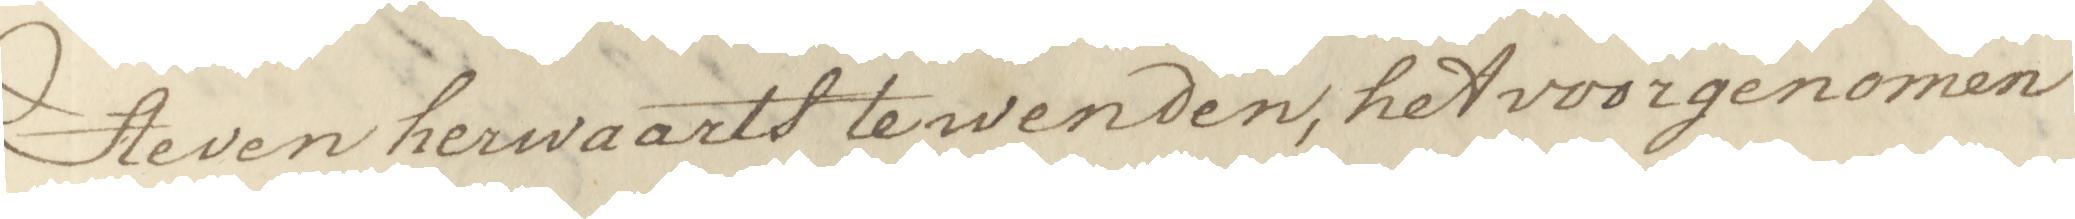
steven herwaarts te wenden, het voorgenomen
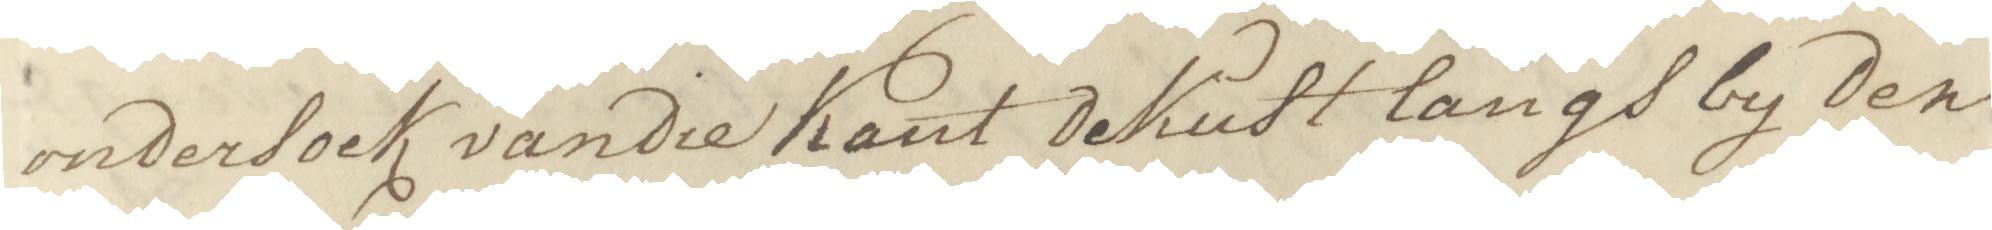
ondersoek van die kant de kust langs by der
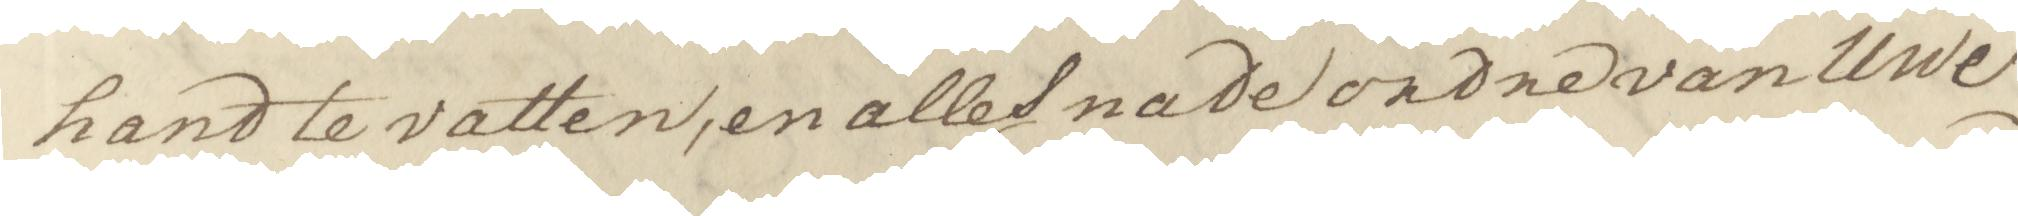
hand te vatten, en alles nade ordre van Uwe
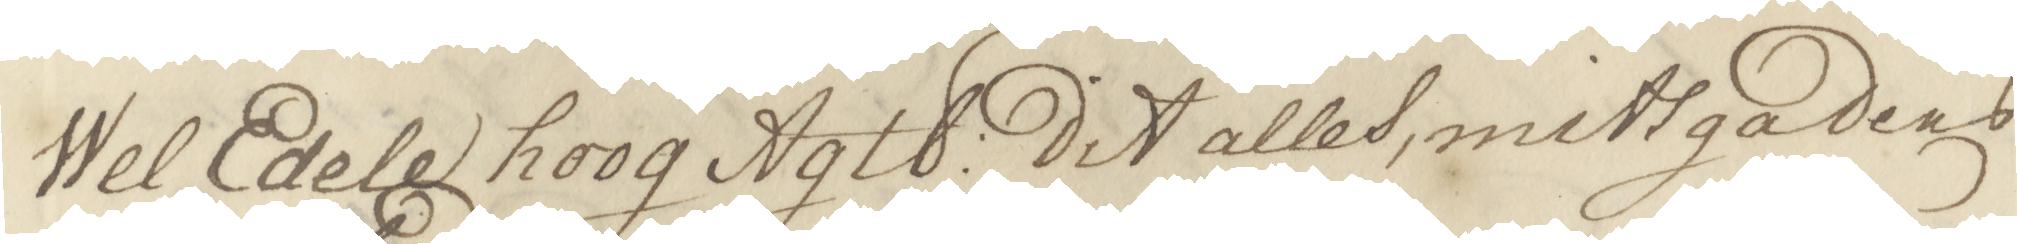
Wel Edele hoog Agtb: dit alles, mitsgaders
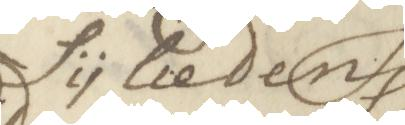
sij lieden
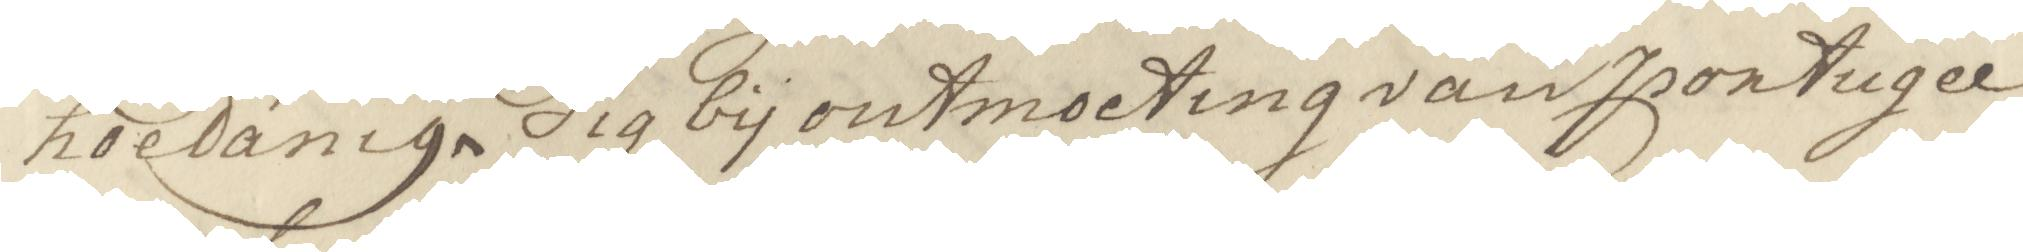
hoedanig, sig bij ontmoeting van portugee
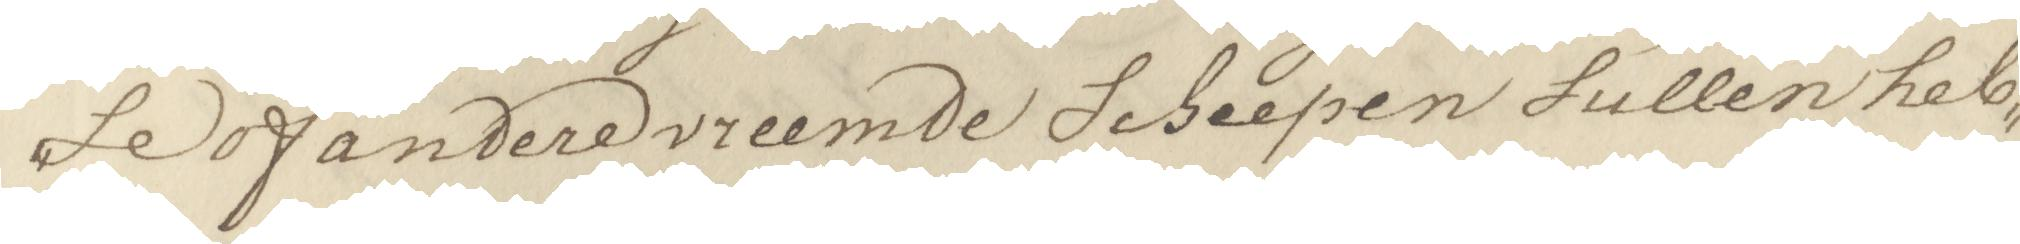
se of andere vreemde scheepen sullen heb„
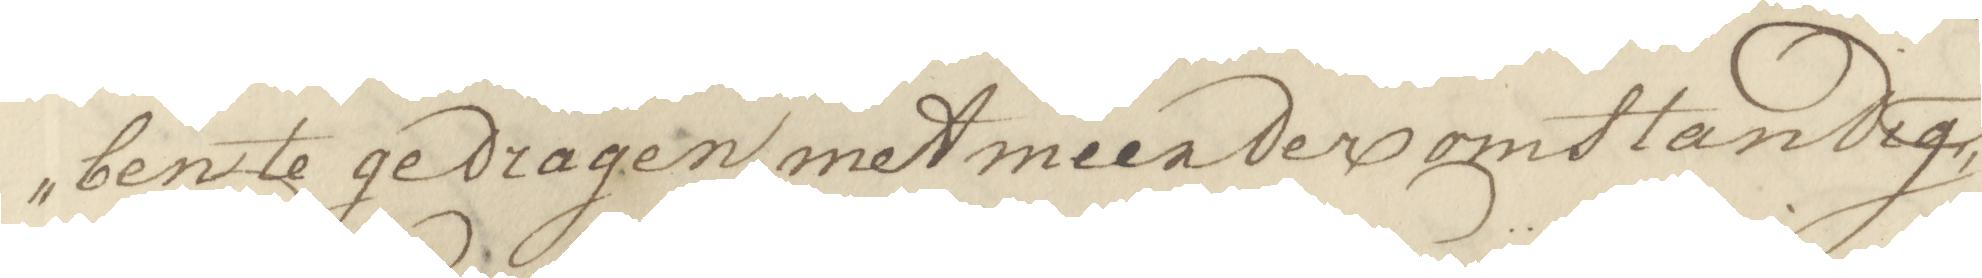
„ben te gedragen, met meerder omstandig„
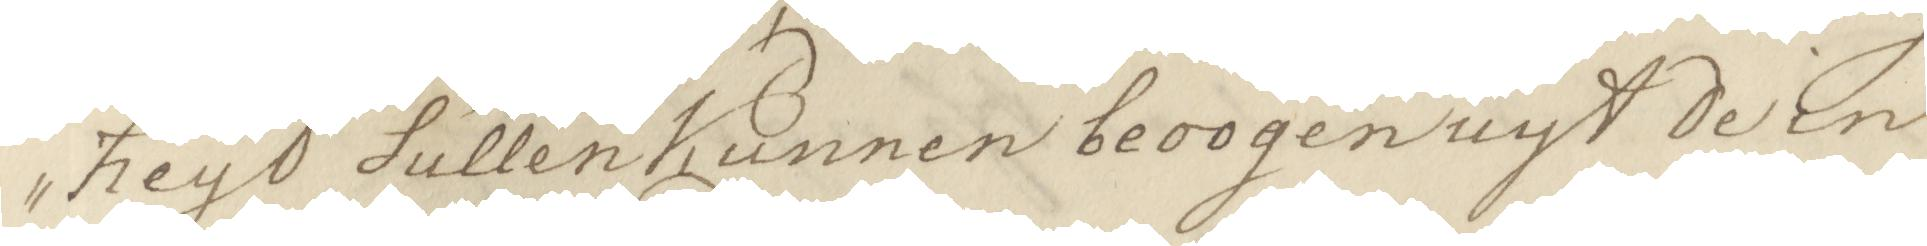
„heijd sullen kunnen beoogen uijt de in
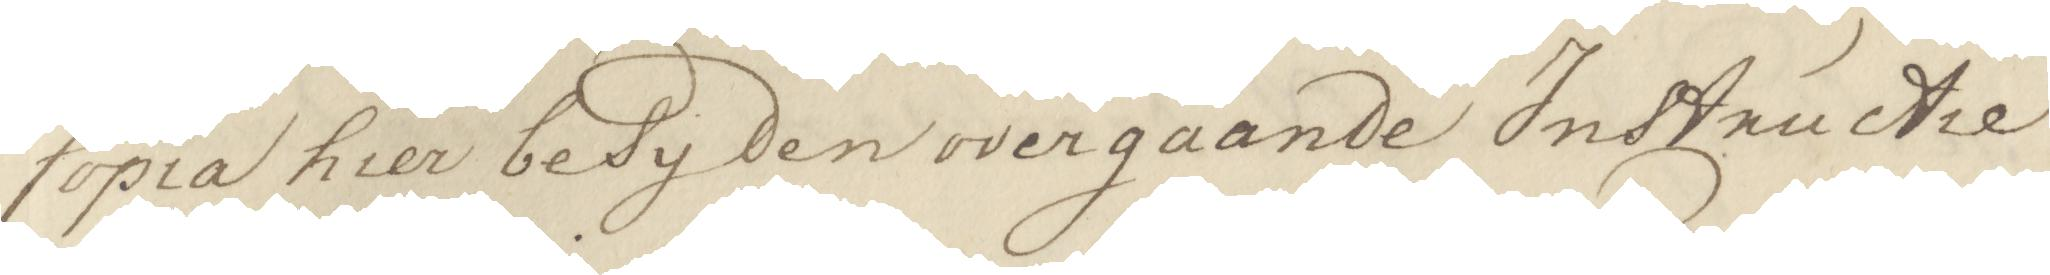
Copia hier besijden overgaande Instructie
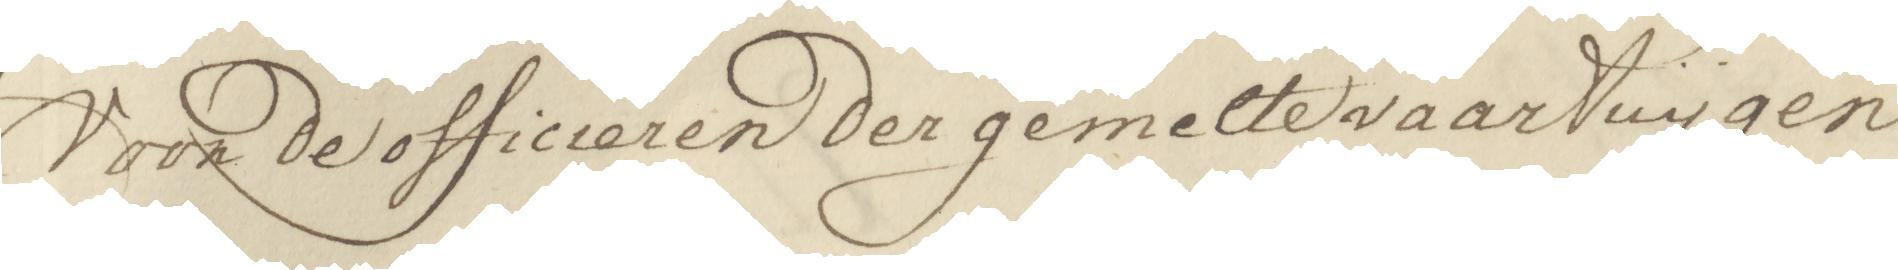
voor de officieren der gemelte vaartuijgen
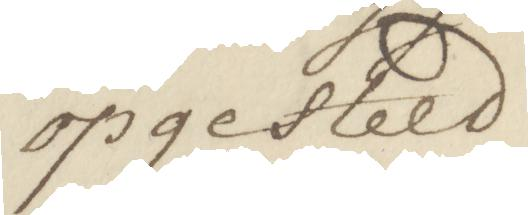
opgesteld
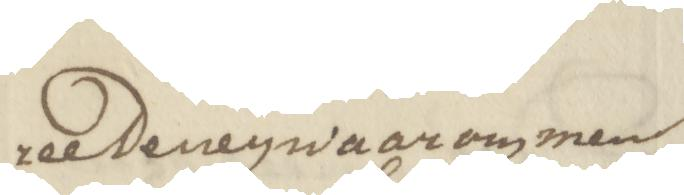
redenen waar om men
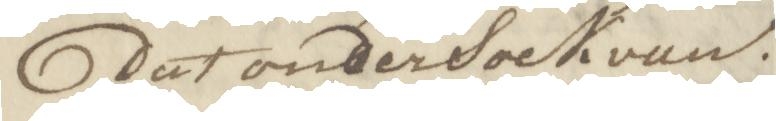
dat ondersoek van
